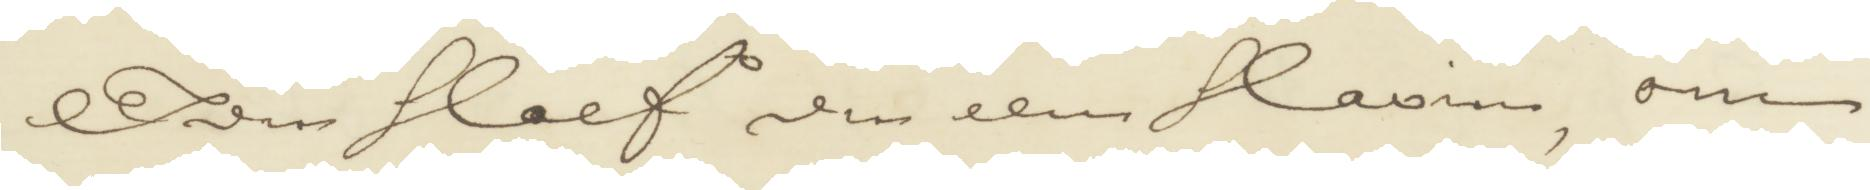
Een slaef en een slavin, om
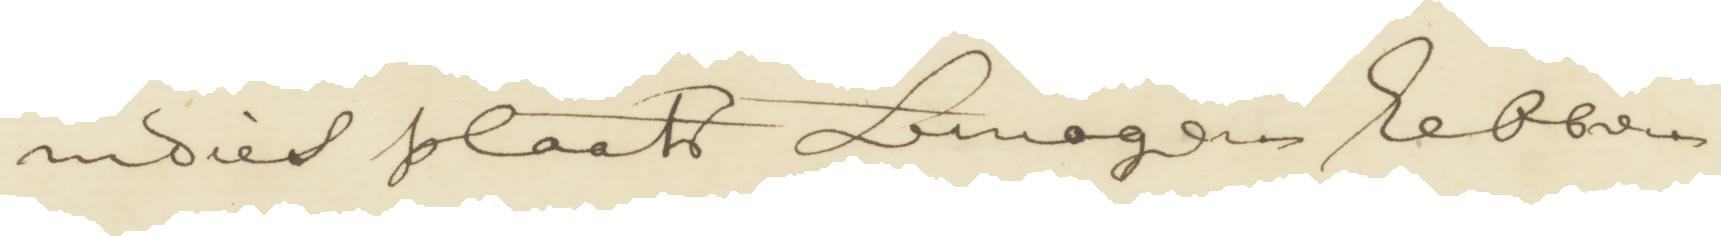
indies plaats temogen hebben
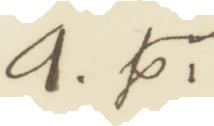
4. p:s
